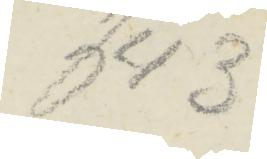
743
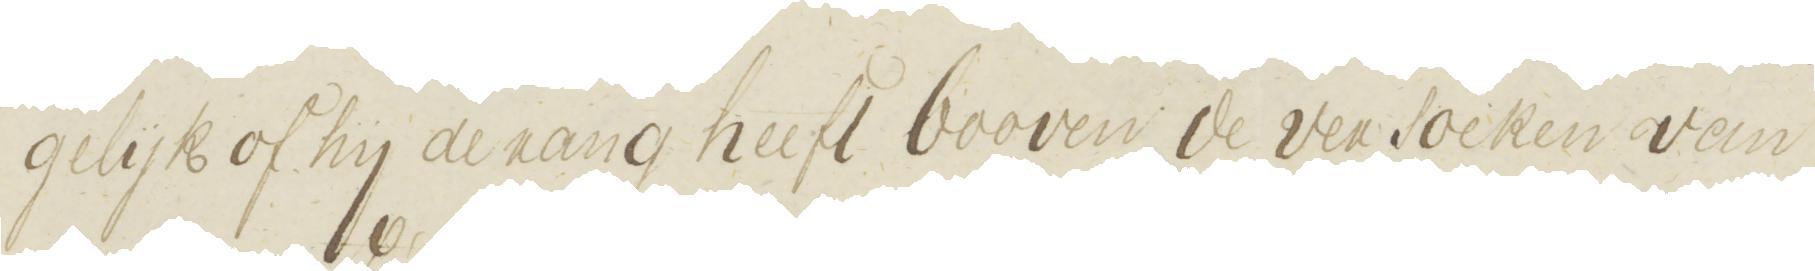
gelijk of hij de rang heeft booven de versoeken van
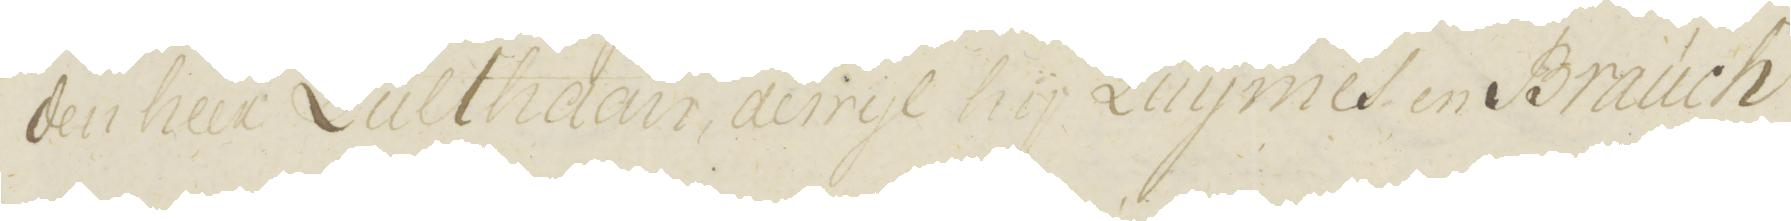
den heer Zulthaan, dewijl hij Luijmes en Brauch
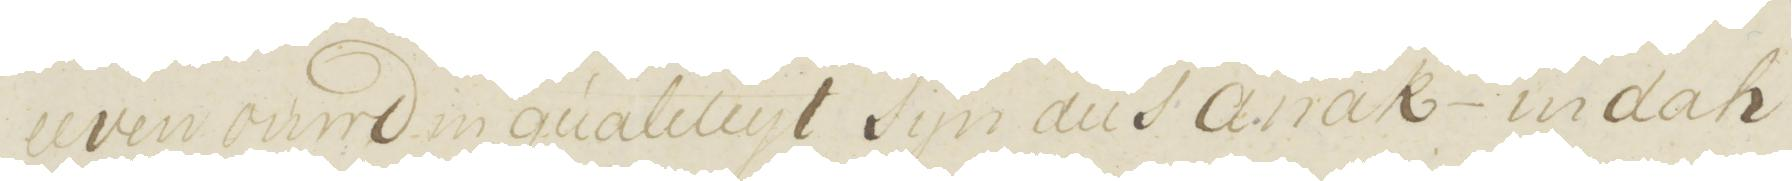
eeven ouwd in qualiteijt sijn dus Anak-indah
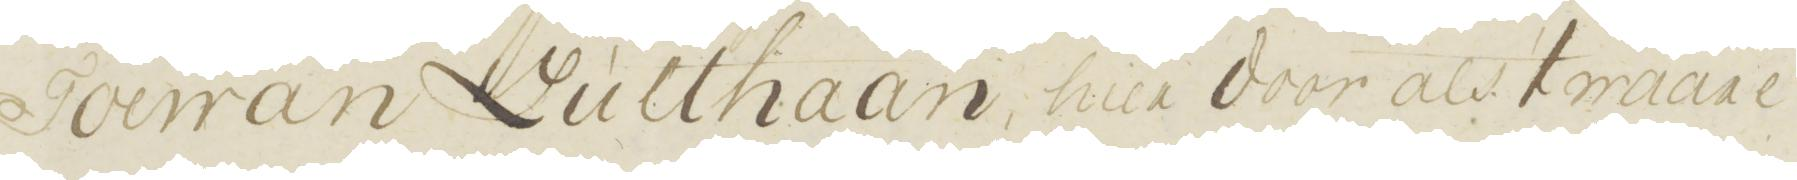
Toewan Zulthaan, hier door als 't waare
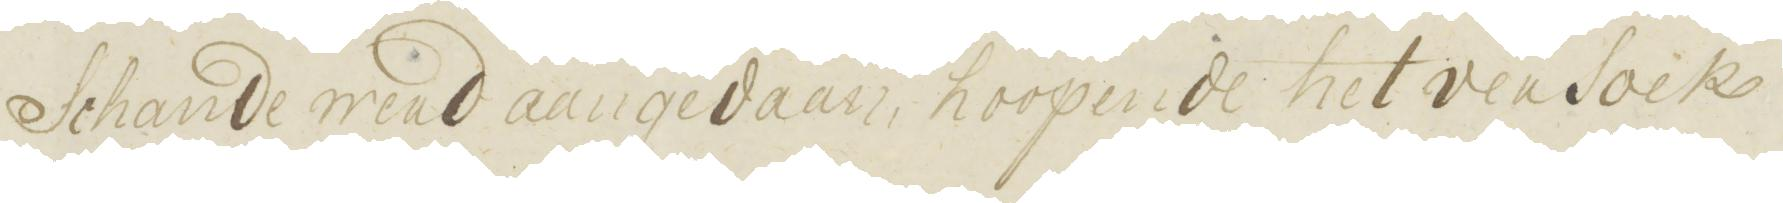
schande werd aangedaan, hoopende het versoek
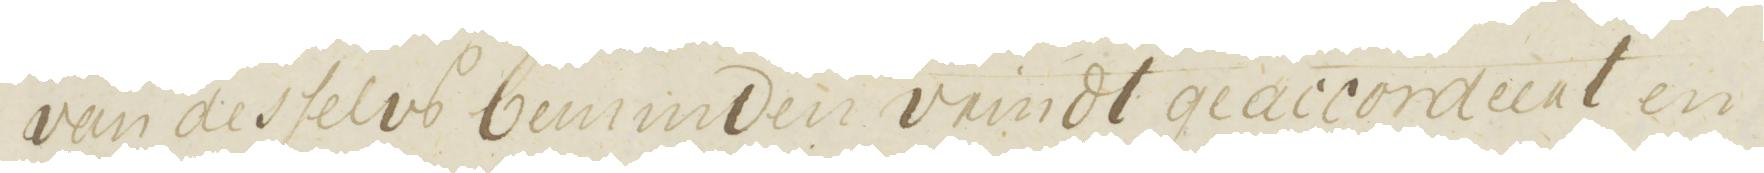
van desselvs beminden vrindt geaccordeert en
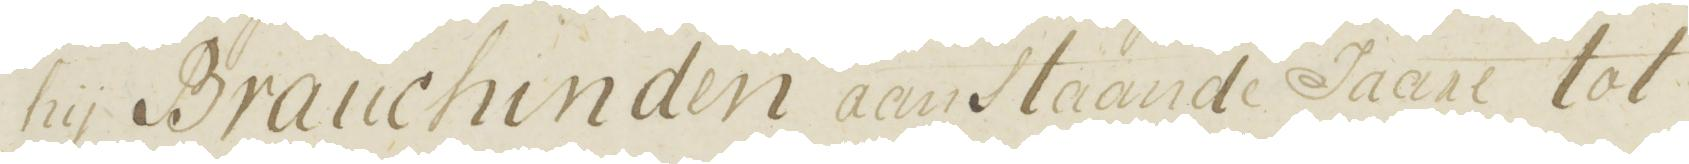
hij Brauch in den aanstaande Jaare tot
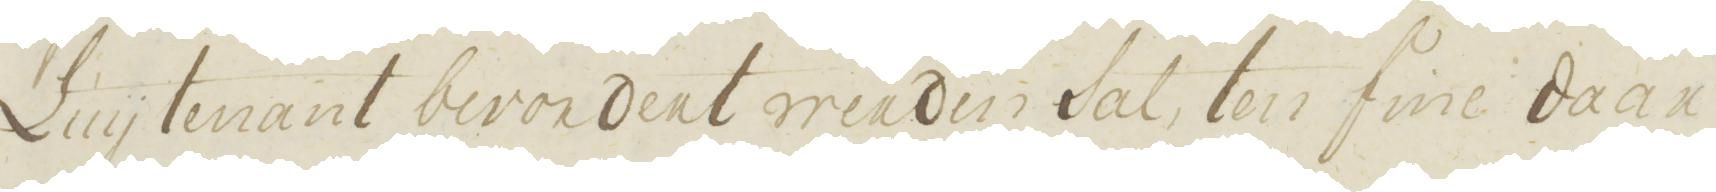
Luijtenant bevordert werden sal, ten fine daar
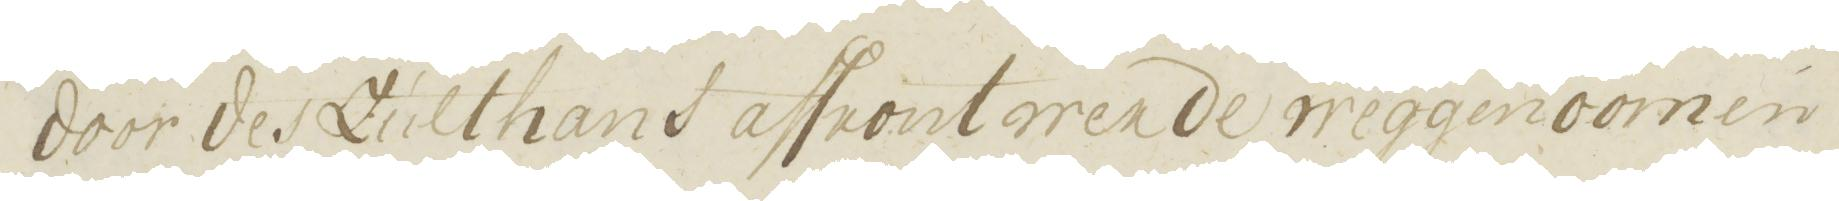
door des Zulthans affront werde weggenoomen
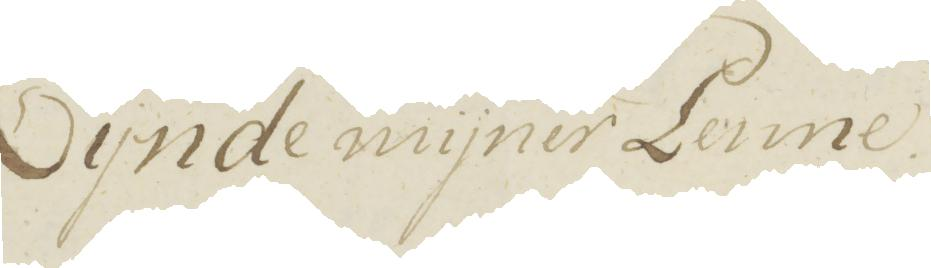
Eijnde mijner Penne.
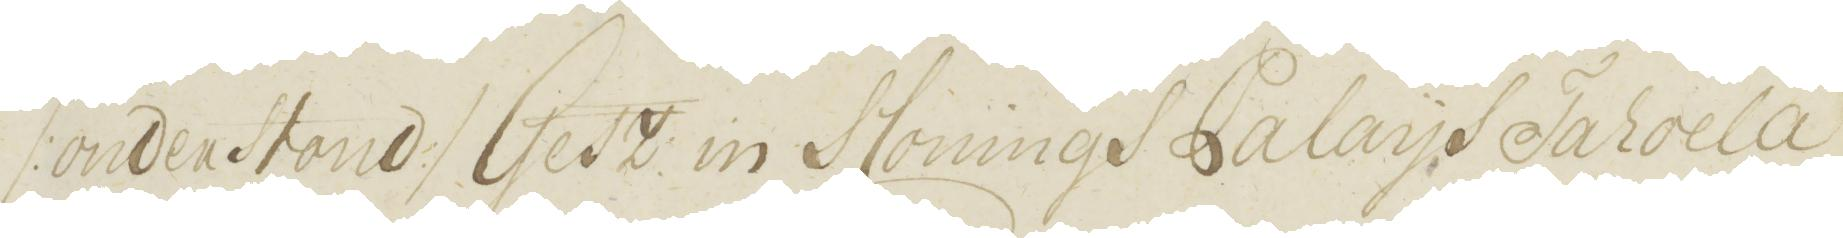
/:onderstond:/ Gesz: in SConings Palaijs Tahoela
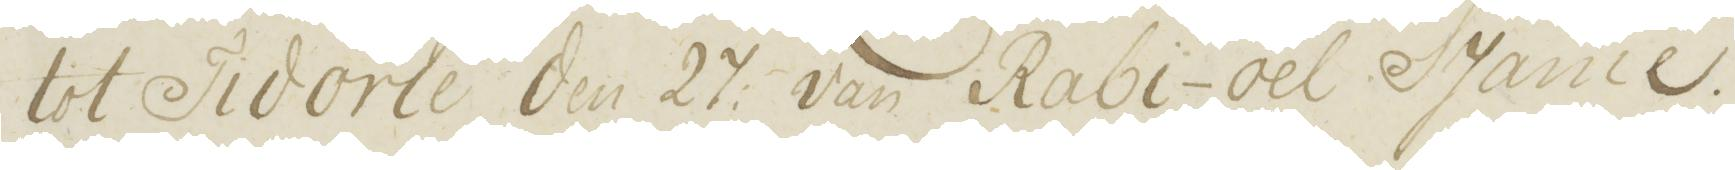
tot Tidorle den 27: van Rabi-oel Sjanie.
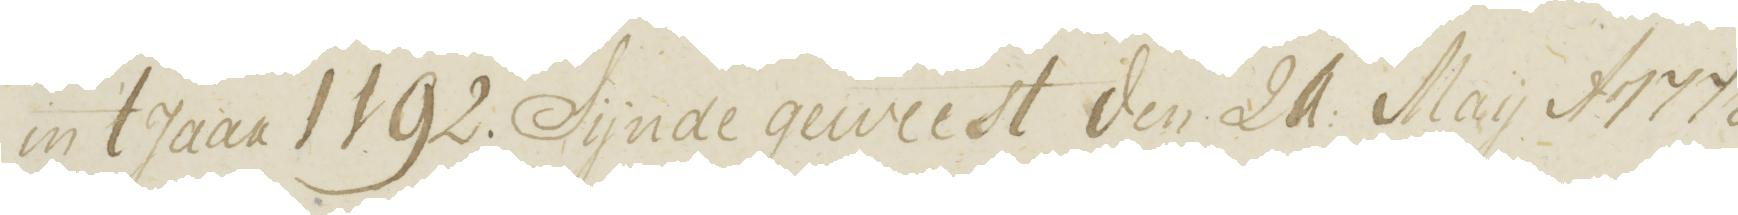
in ’t Jaar 1192 . Sijnde geweest den 24: Maij Ao 177
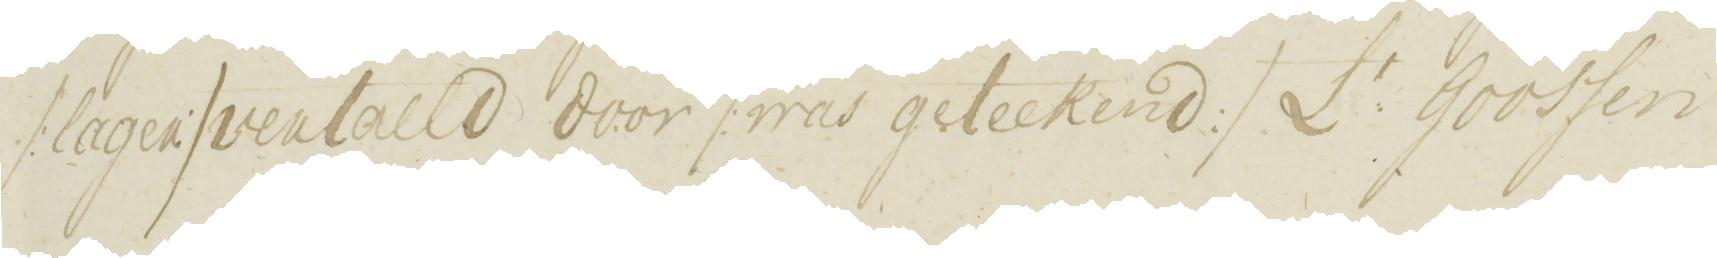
/:lager:/ vertaeld door /:was geteekend:/ L:t Goossen
